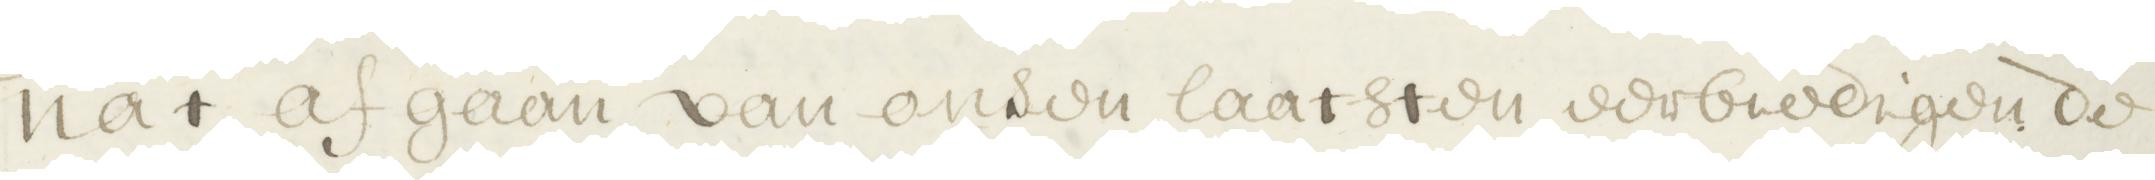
na 't afgaan van onsen laatsten eerbiedigen de
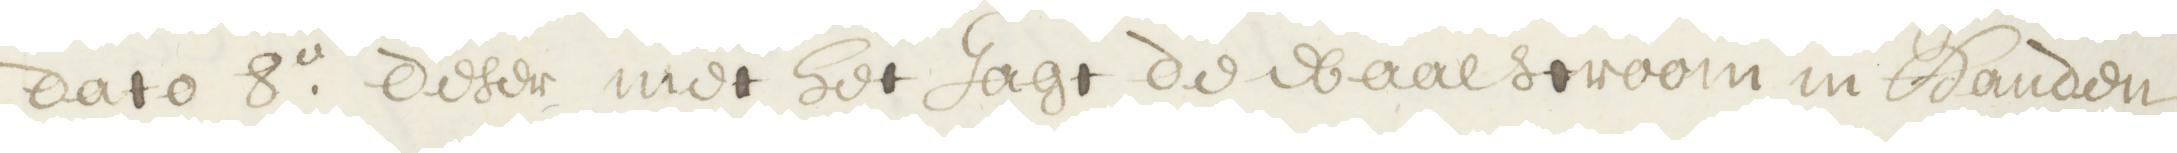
dato 8.e deser met het Jagt de waalstroom in handen
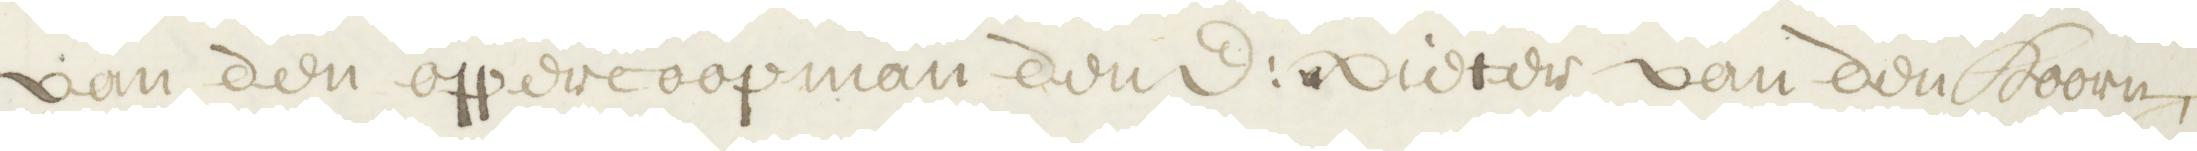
van den oppercoopman den E: pieter van den hoorn
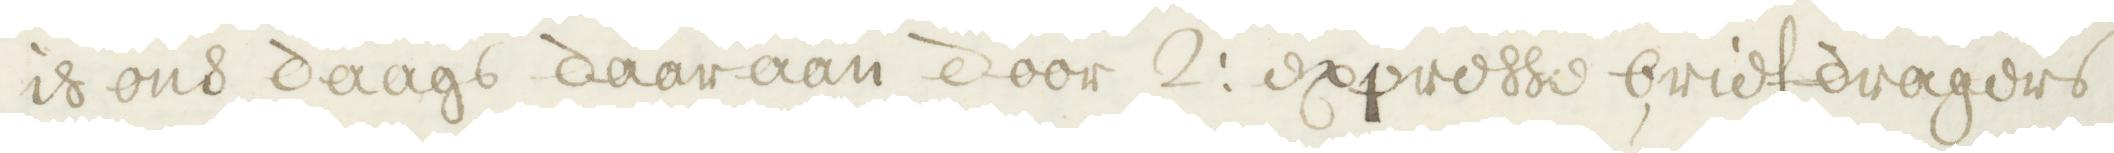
is ons daags daar aan door 2: expresse briefdragers
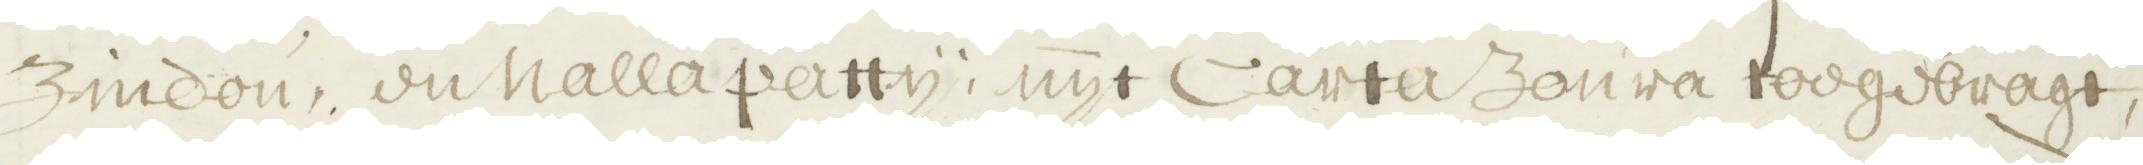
zindou, en nallapattij, uijt Cartazoura toegebragt,
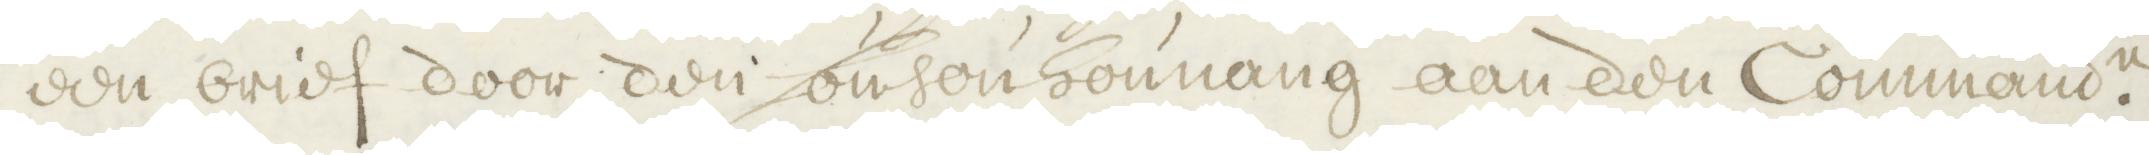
een brief door den sousouhounang aan den Command„r
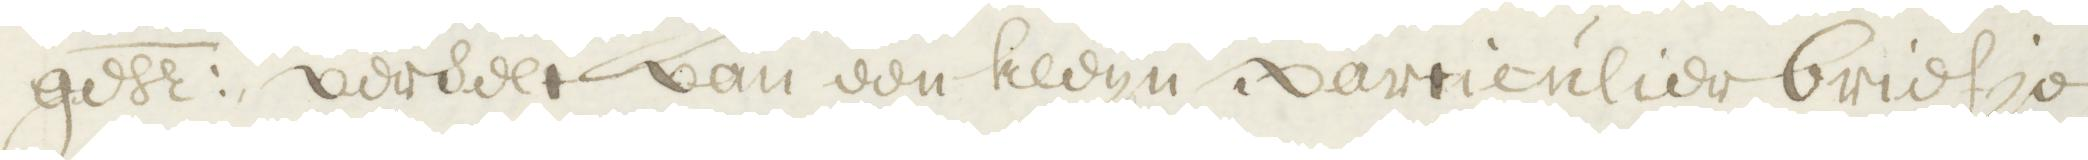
gesz: verselt van een kleijn particulier briefje
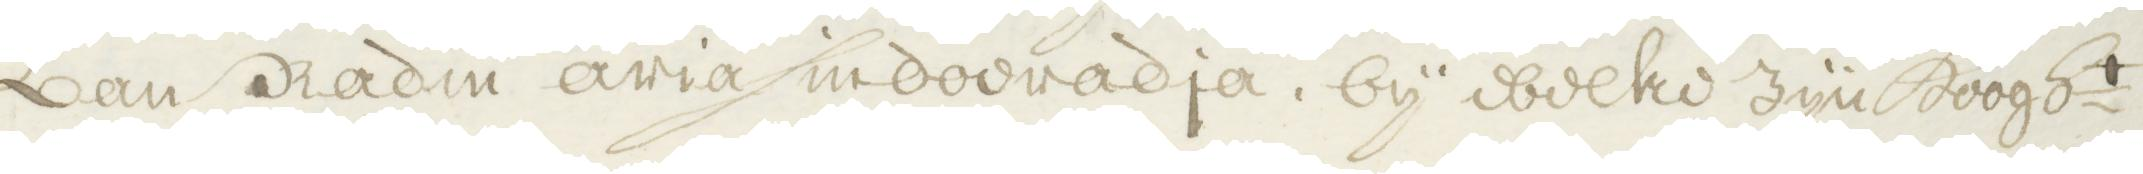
van Radin aria sindoeradja, bij welke zijn Hoogh=t
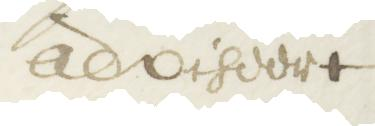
adviseert
